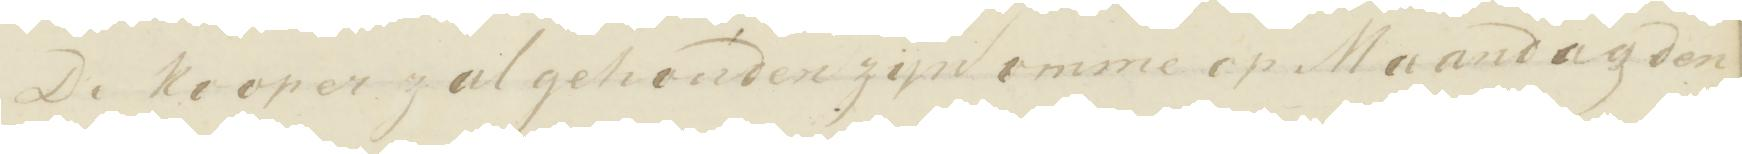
De kooper zal gehouden zijn omme op Maandag den
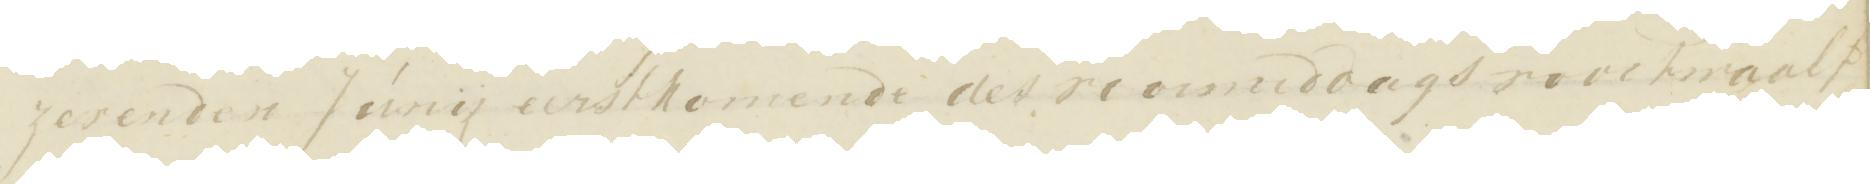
zevenden Junij eerstkomende des voormiddags voor twaalf
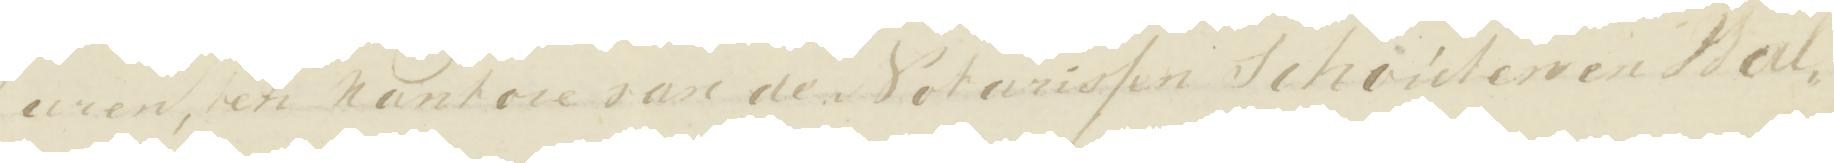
uren, ten Kantore van den Notarissen Schouten en Wal„
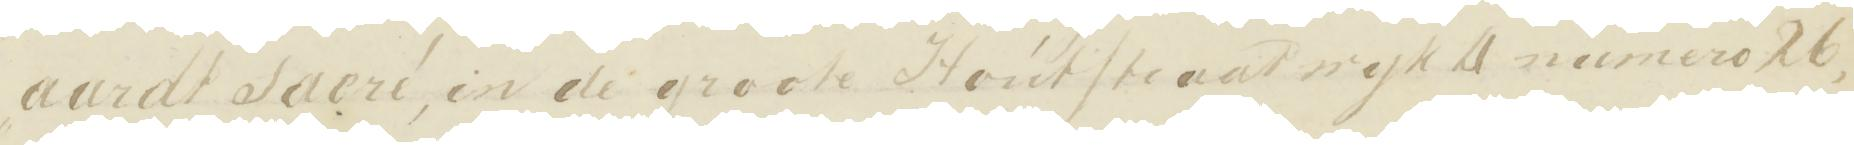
aardt Sacré, in de groote Houtstraat wyk 4 numero 26,
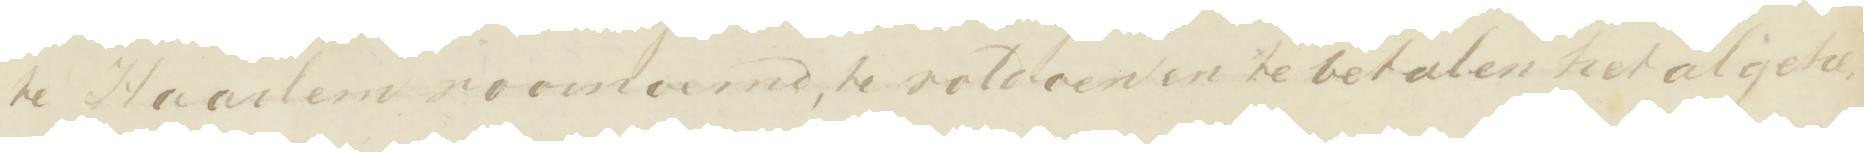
te Haarlem voornoemd, te voldoen en te betalen het afgehe„
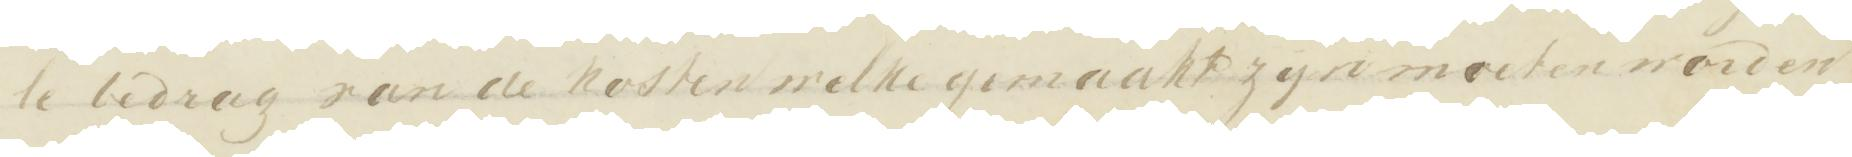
le bedrag van de kosten welke gemaakt zijn moeten worden
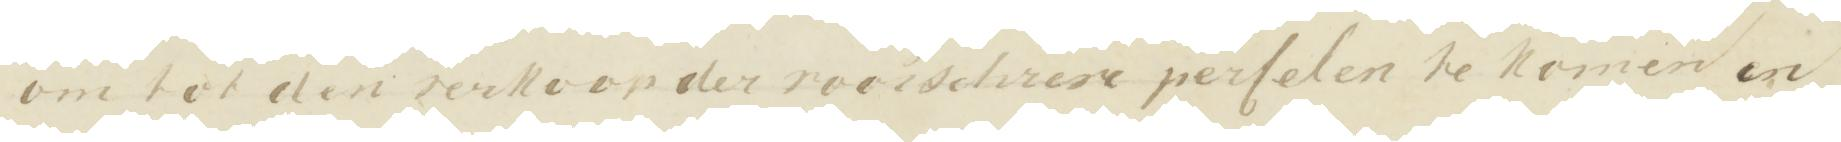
om tot den verkoopder voorschreve percelen te komen en
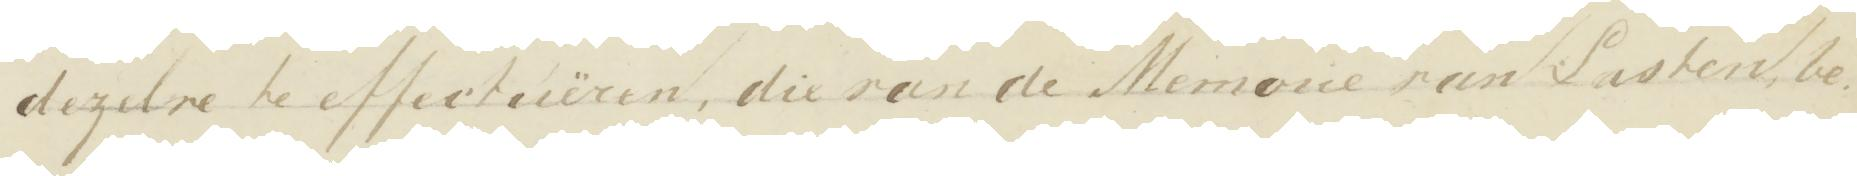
dezelve te effectuëren, die van de Memorie van Lasten, be„
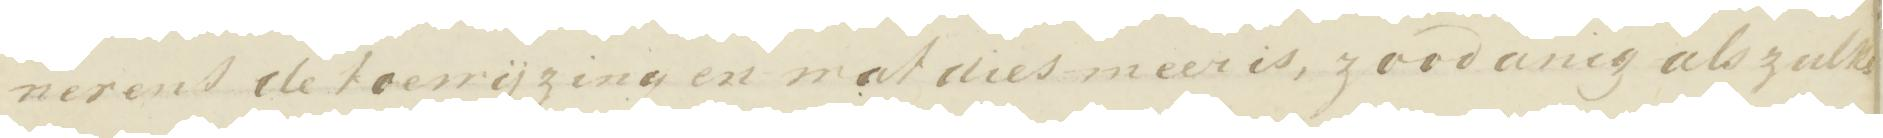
nevens de toewijzing en wat dies meer is, zoodanig als zulks
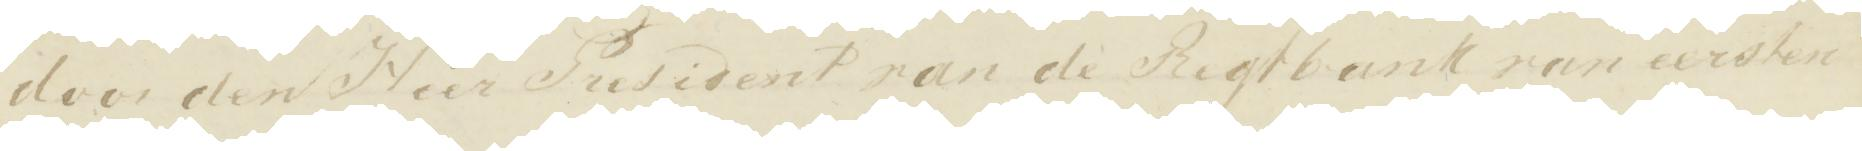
door den Heer President van de Regtbant van eersten
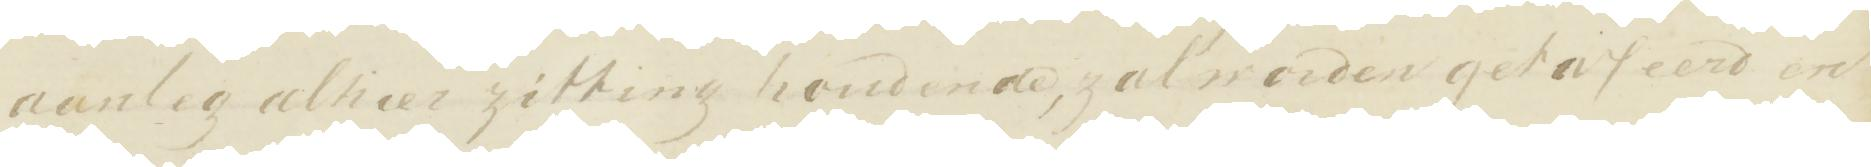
aanleg alhier zitting houdende, zal worden getaxeerd en
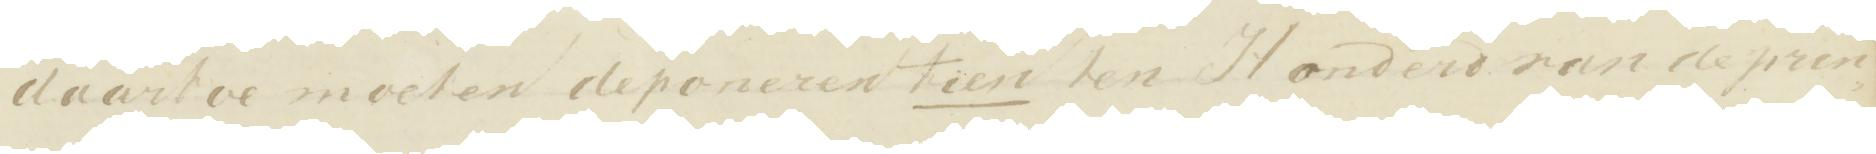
daartoe moeten deponeren tien ten Honderd van de prin„
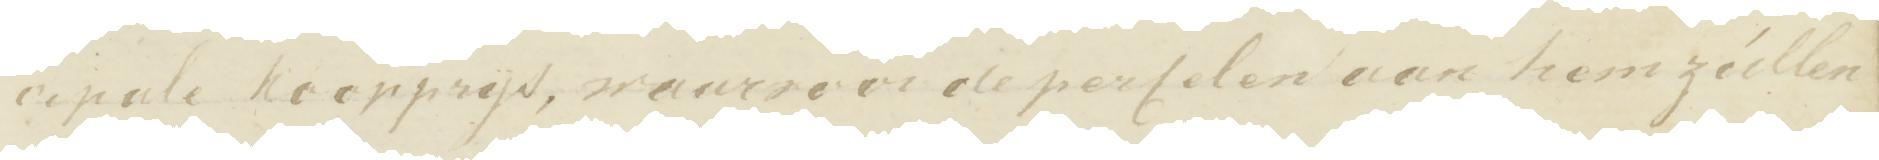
cipale koopprijs, waarvoor de percelen aan hem zullen
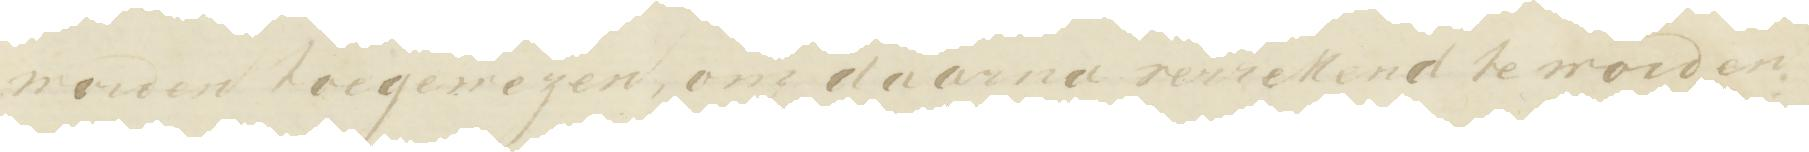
worden toegewezen, om daarna verrekend te worden,
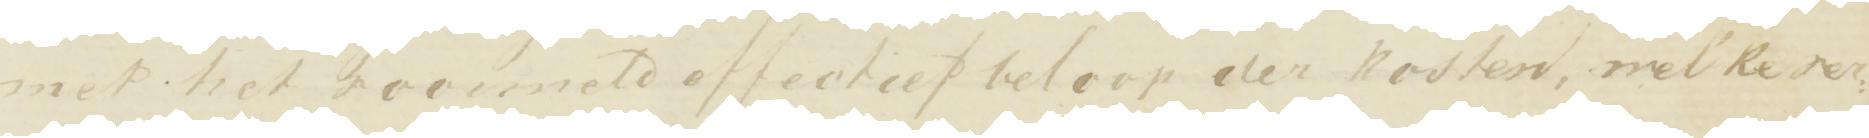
met het voormeld effectief beloop der kosten, welke ver„
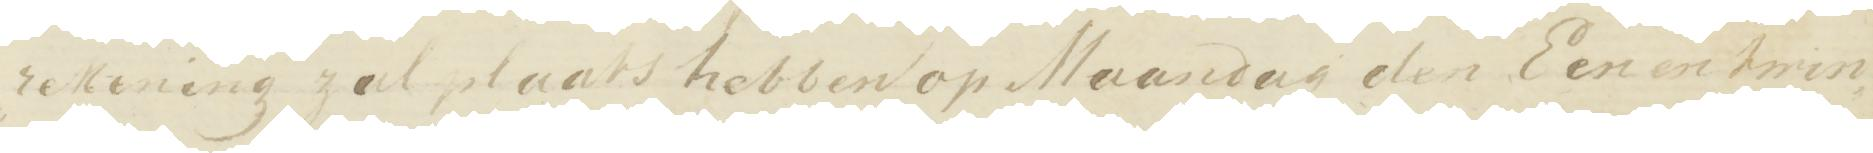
rekening zal plaats hebben op Maandag den Een en twin„
